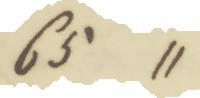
65 „
